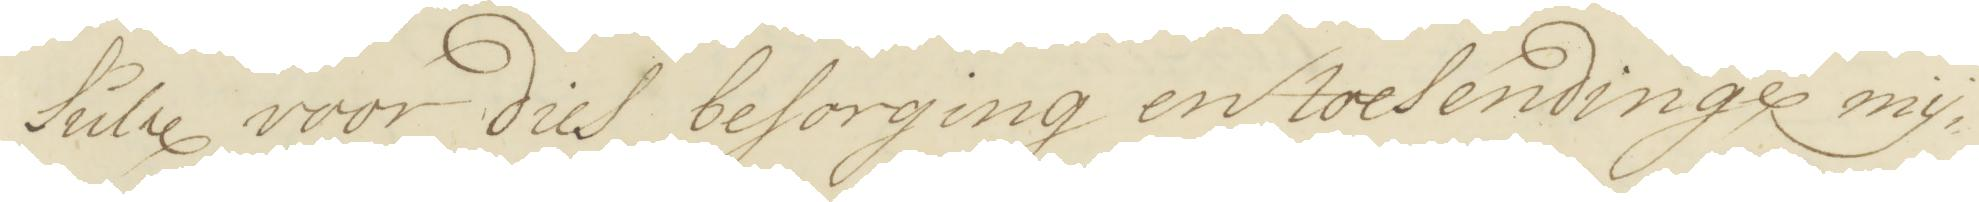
sulx voor dies besorging en toesendinge mij„
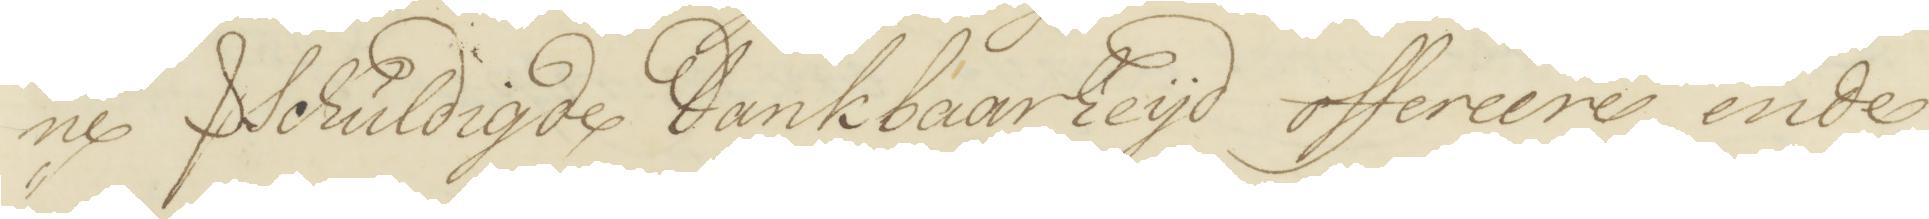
„ne verschuldigde dankbaarheijd offereere ende
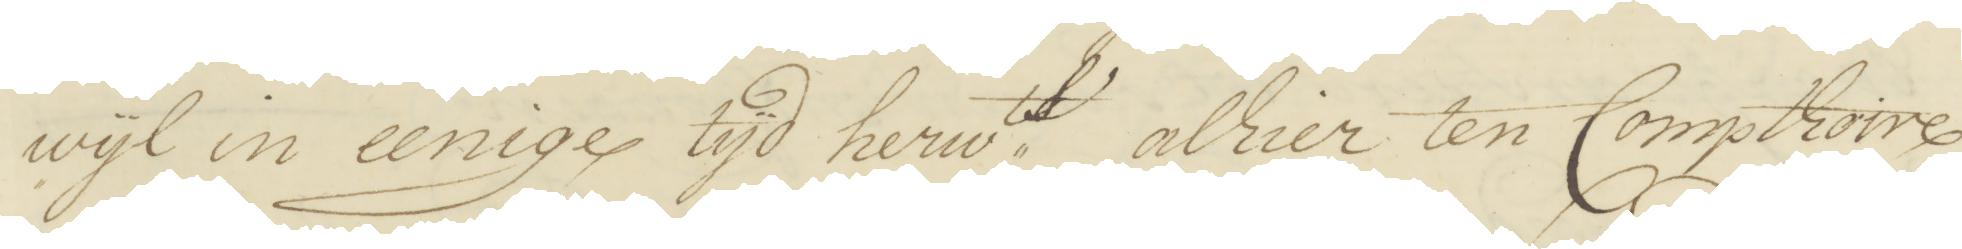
„wijl in eenige tijd herw„ts alhier ten Compthoire
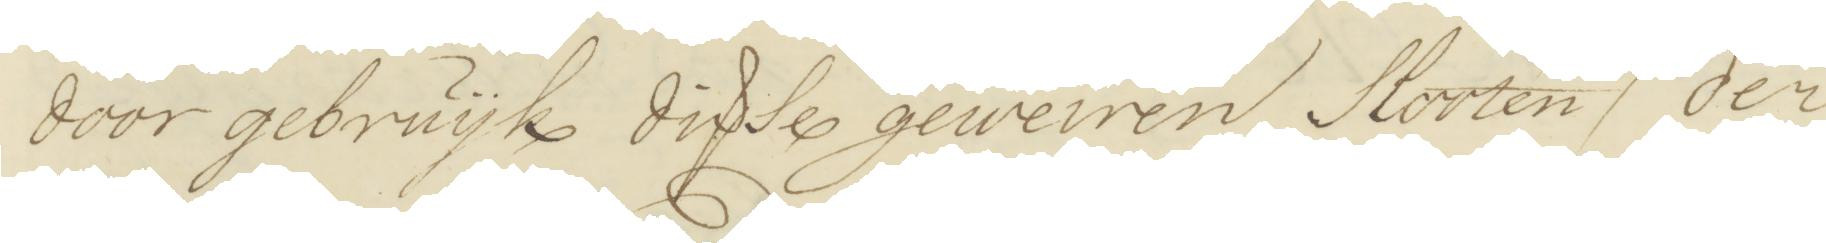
door gebruijk diverse geweiren slooten der
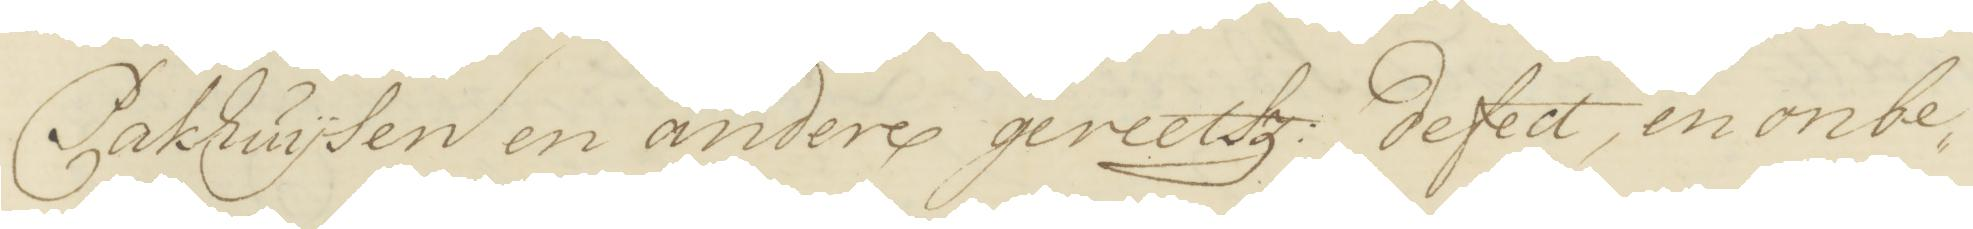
Pakhuijsen en andere gereetsz: defect, en onbe„
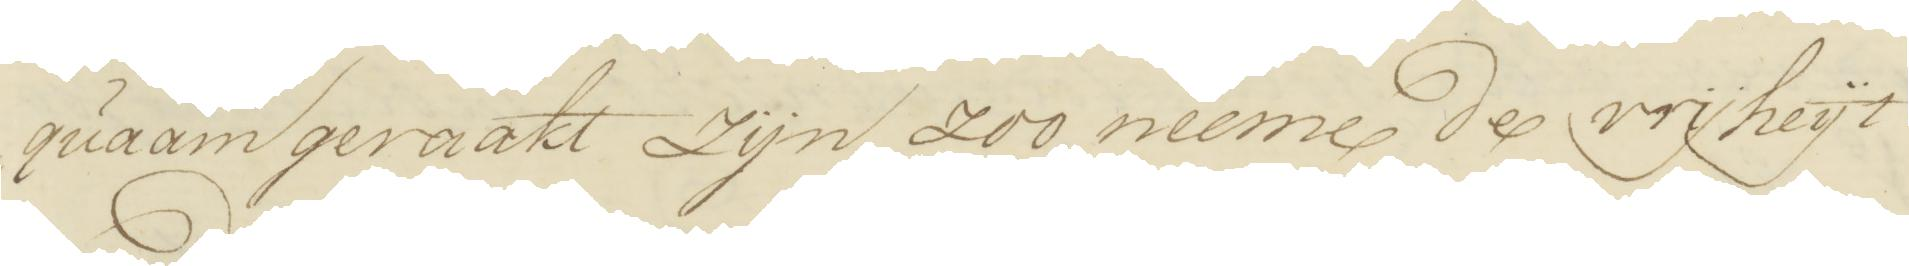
quaam geraakt zijn, zoo neeme de vrijheijt
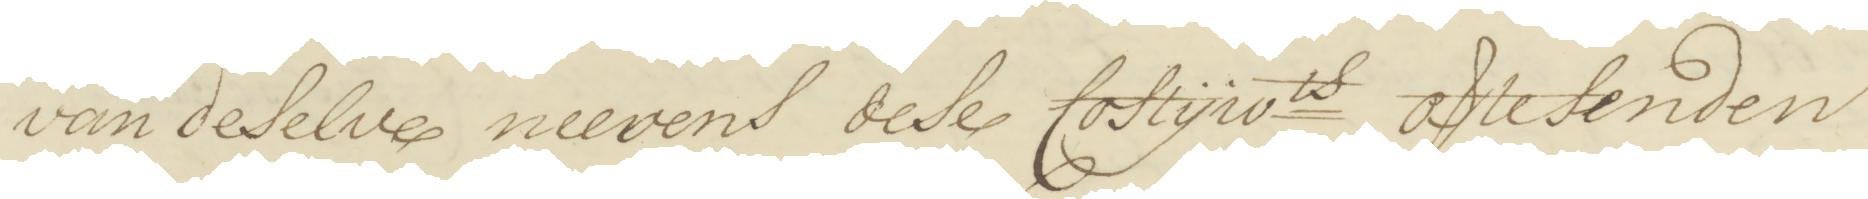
van deselve neevens dese Costijw=ts overtesenden
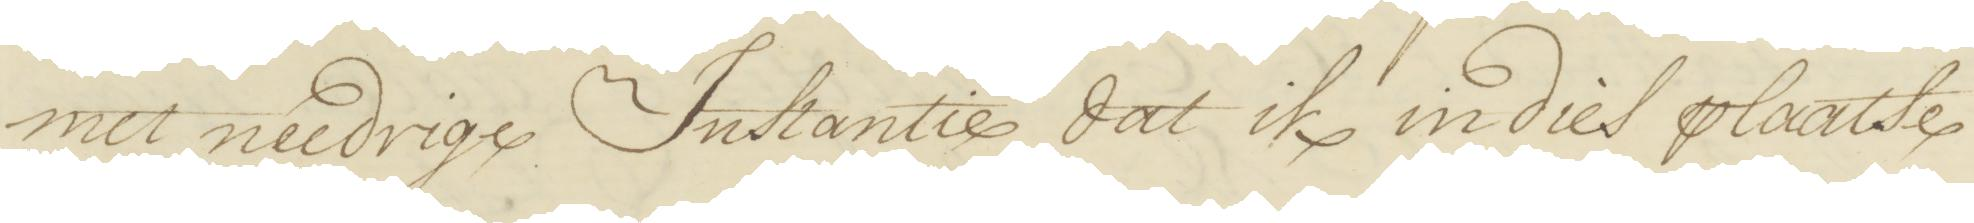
met needrige Instantie dat ik in dies plaatse
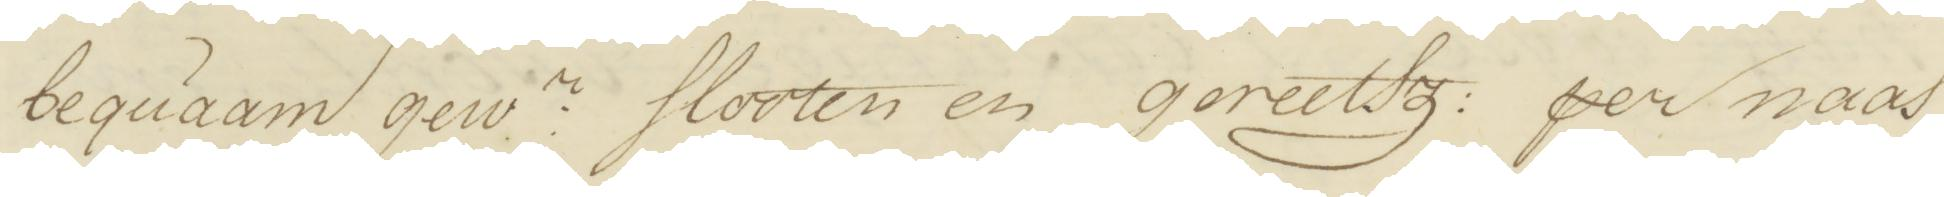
bequaam gew:r slooten en gereetsz: per naas
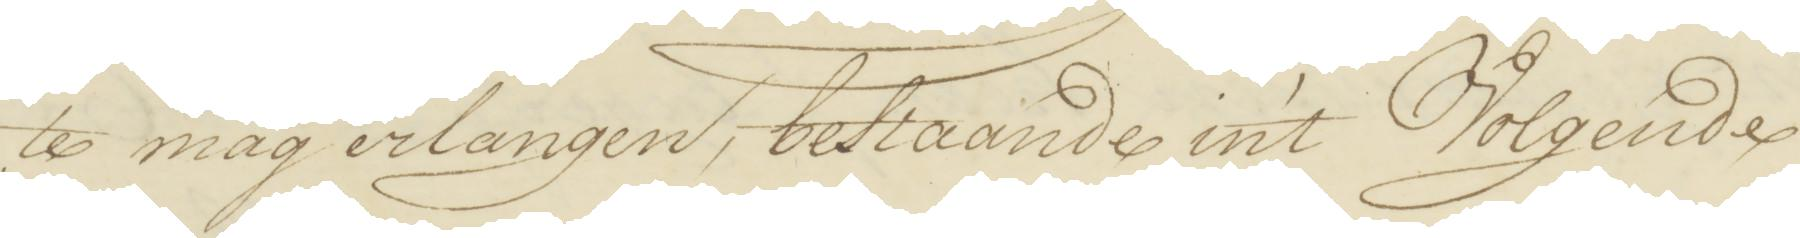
te mag erlangen, bestaande in't Volgende
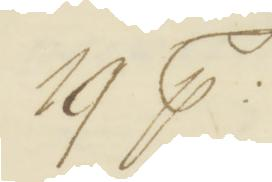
19 p:s
